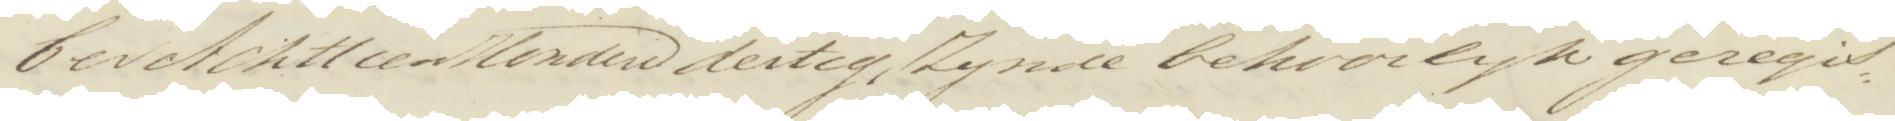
ber Achttien Honderd dertig, Zynde behoorlyk geregis„
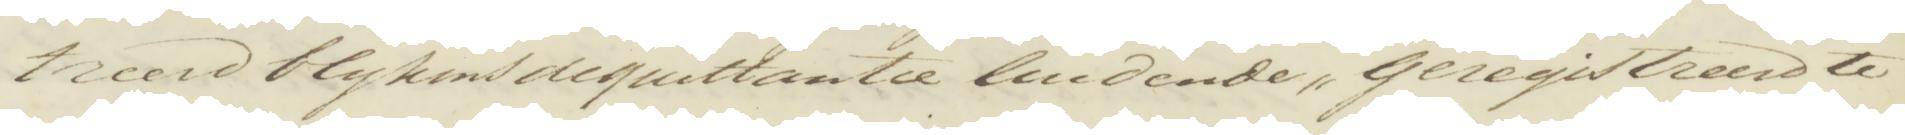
treerd blykens de quittantie luidende „geregistreerd te
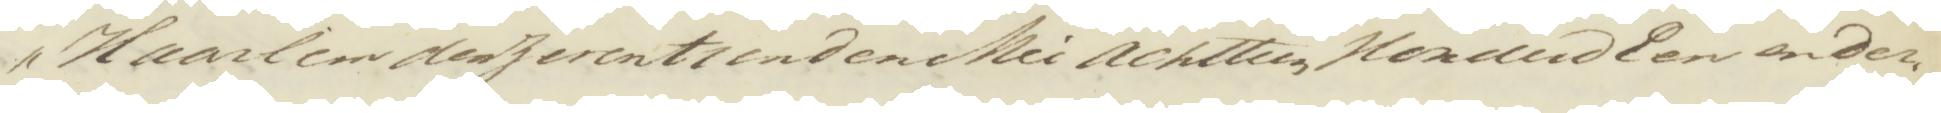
„ Haarlem den Zeventien den Mei achttien Honderd Een en der„
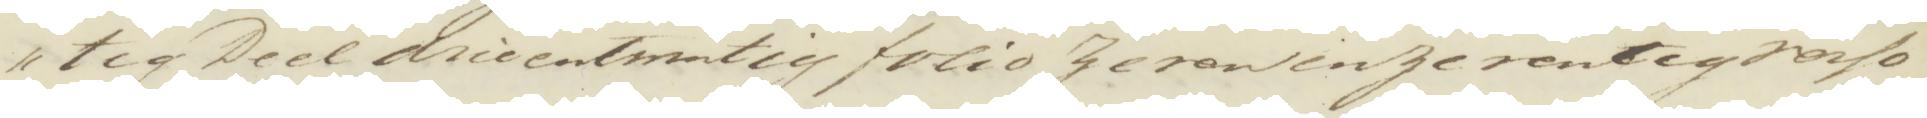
„tig Deel drie en twintig folio Zeven en Zeventig verso
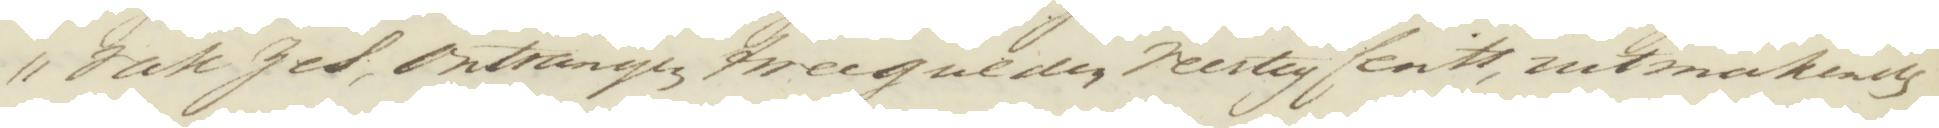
„ vak zes, ontvangen twee gulden Veertig Cents, uitmakende
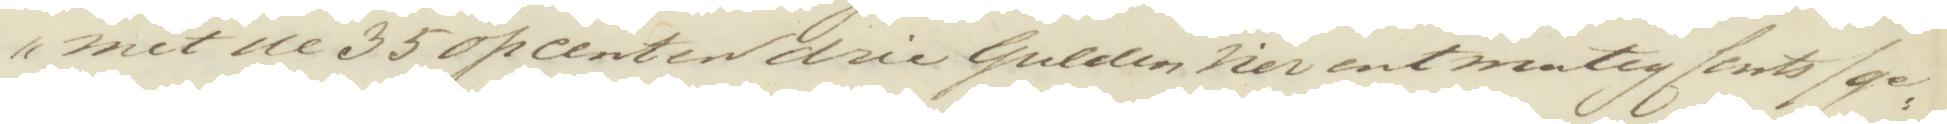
„met de 35 opcenten drie Gulden vier en twintig Cents / ge„
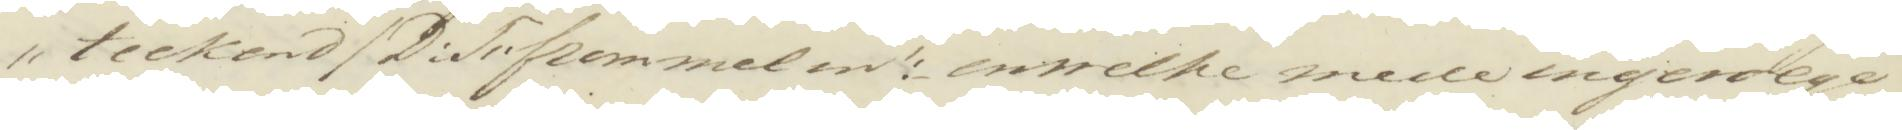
„teekend/ D: F: Crommelin" en welke mede ingevolge
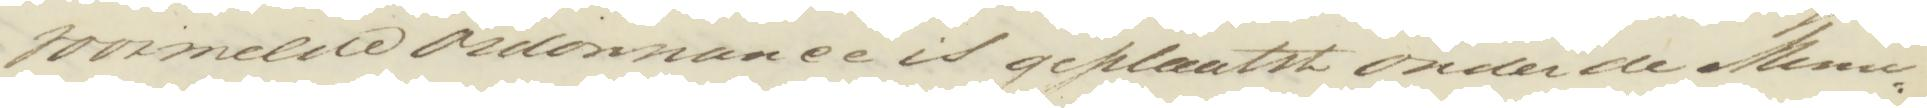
voormelde ordonnance is geplaatst onder de Minu„
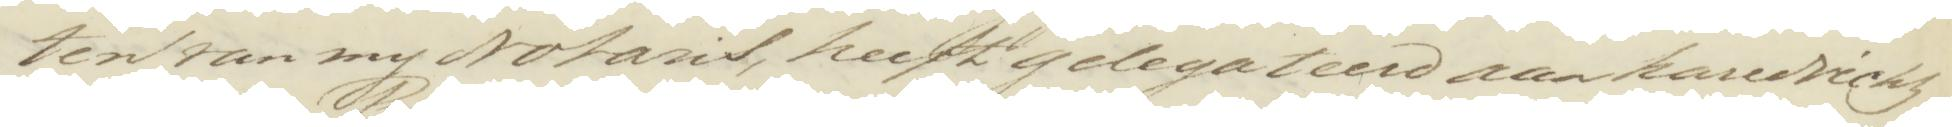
ten van my Notaris, heeft gelegateerd aan hare nicht
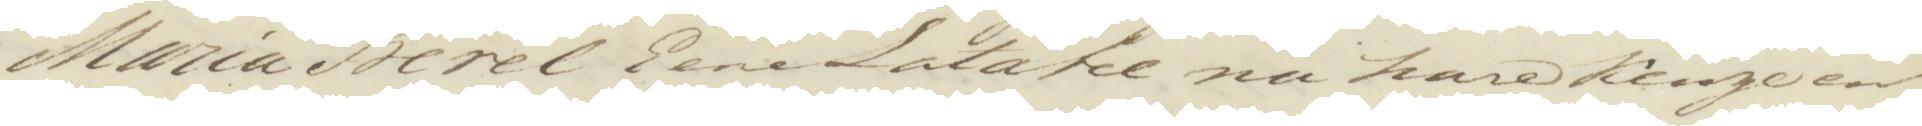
Maria Bevel Eene Latafel na hare keuze en
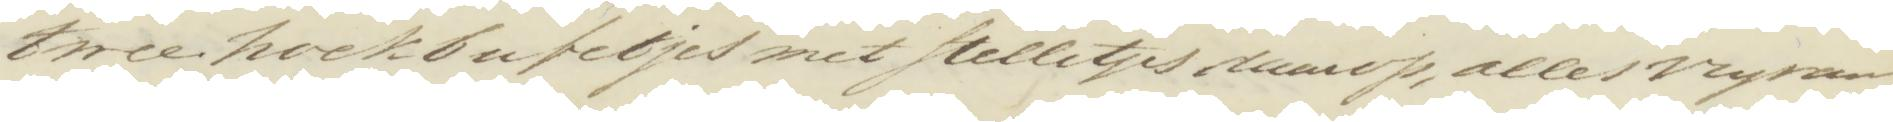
twee hoekbufetjes met stelletjes daarop, alles vry van
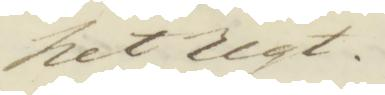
het regt.
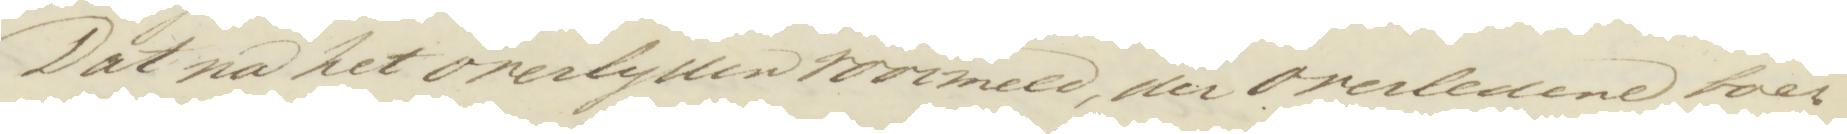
Dat na het overlyden voormeld, der overledene boe
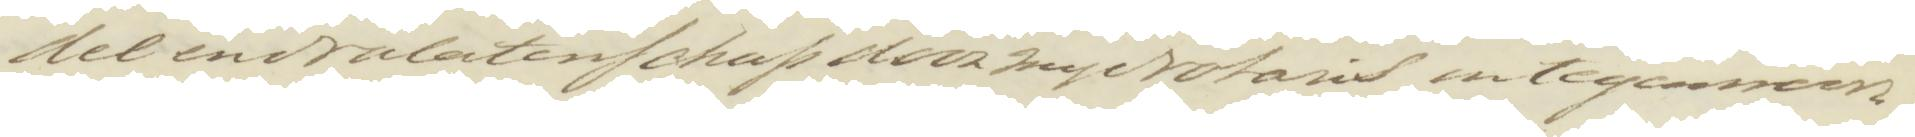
del en Nalatenschap door my Notaris in tegenwoor
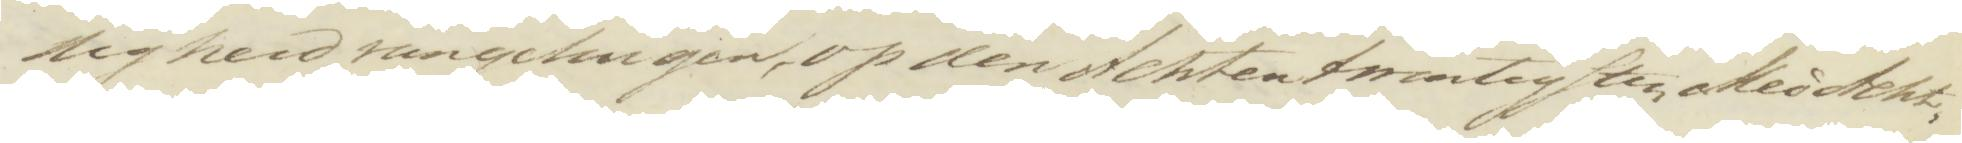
digheid van getuigen, op den Acht en twintigstigen Mei Acht,
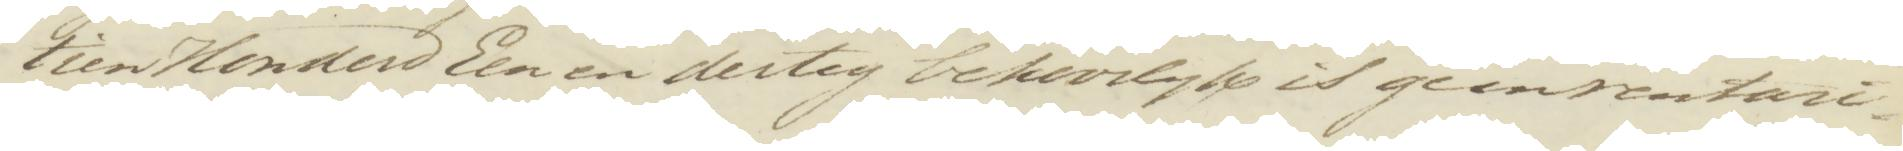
tien Honderd Een en dertig behoorlyk is geinventari-
